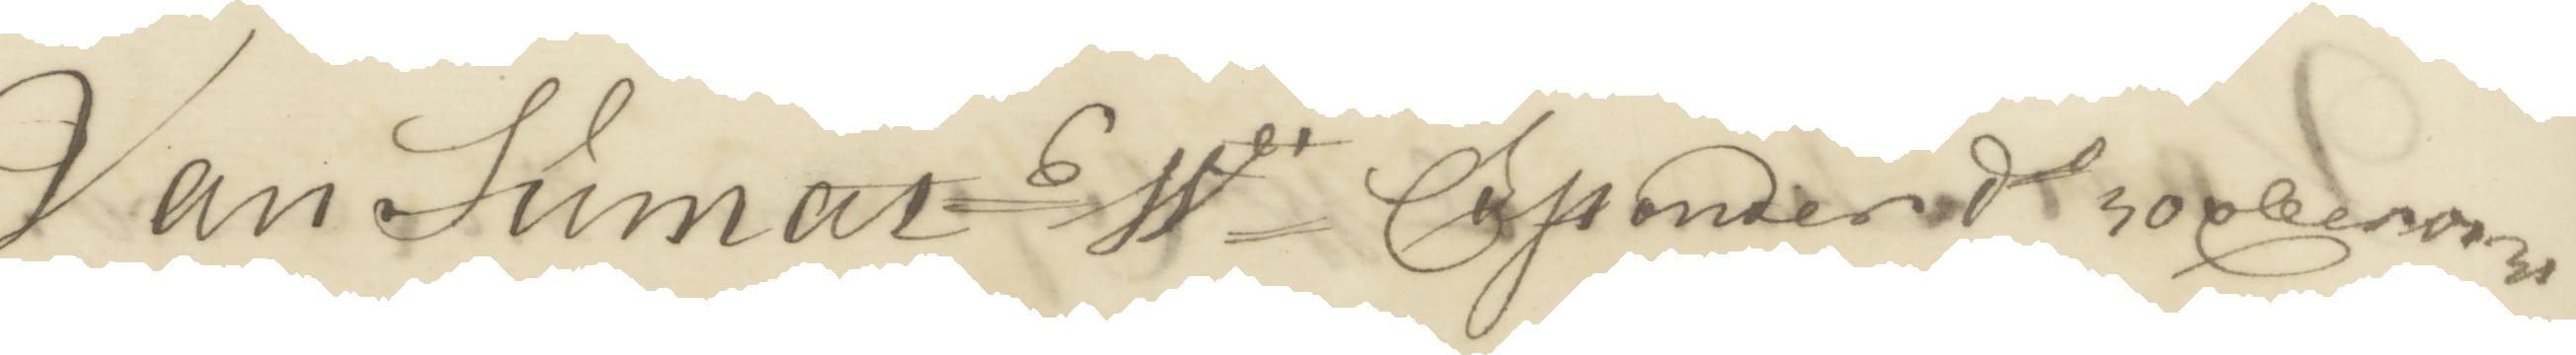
Van Sumat=s W=t Cust onder d=o 30 xber 1731
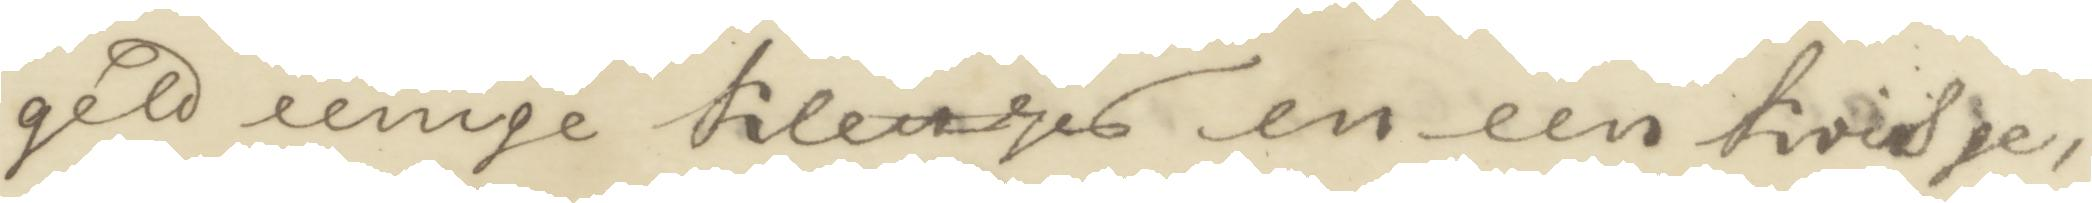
geld eenige kleetjes en een kris ge,
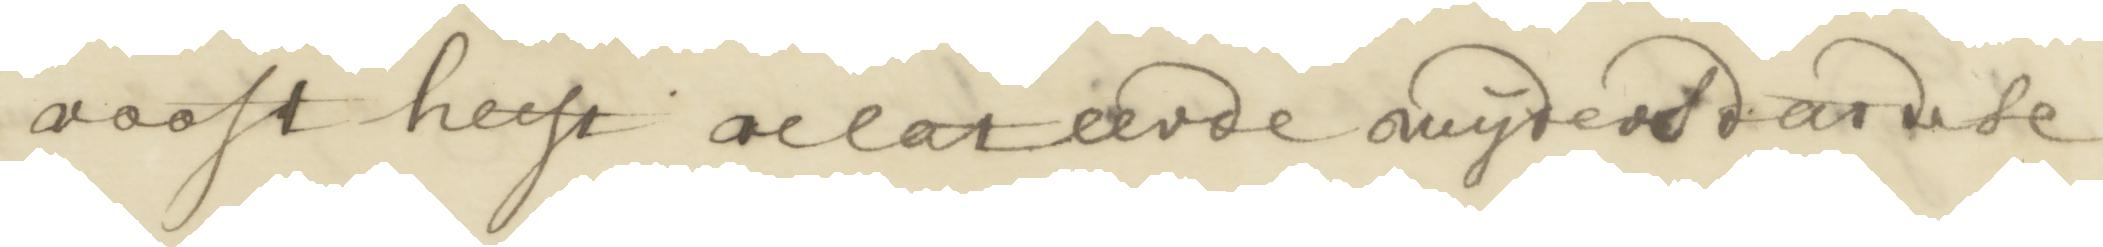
rooft heeft relateerde wijders dat dese
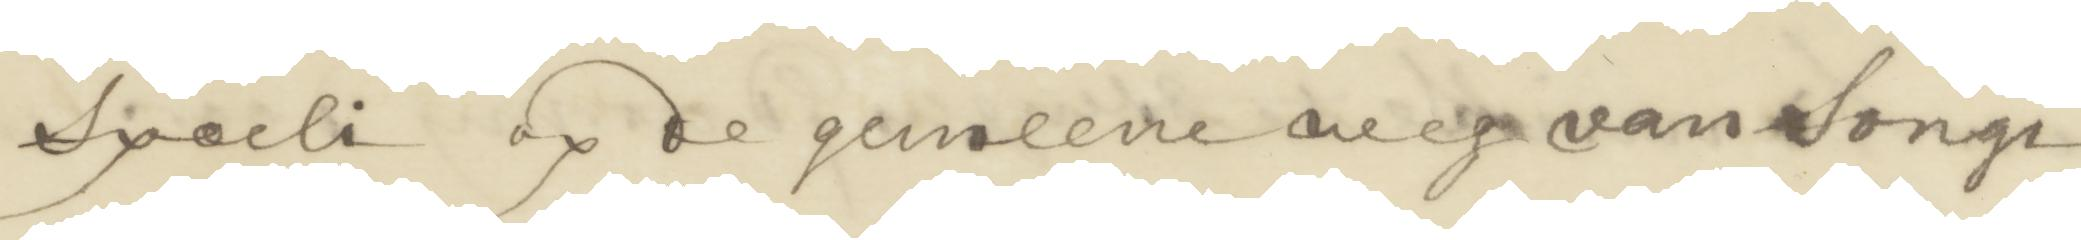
spoeli op de gemeene weg van Songi
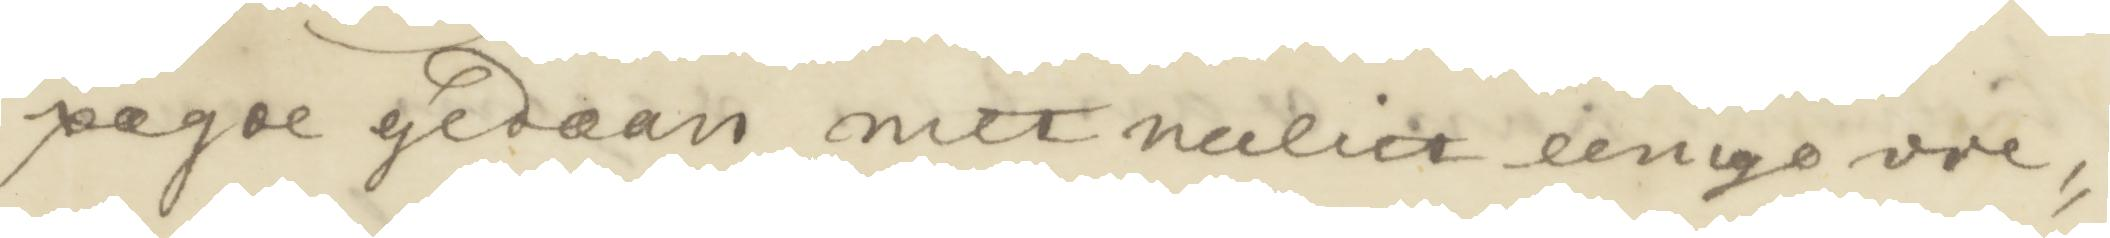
pagoe gedaan niet naliet eenige vee„
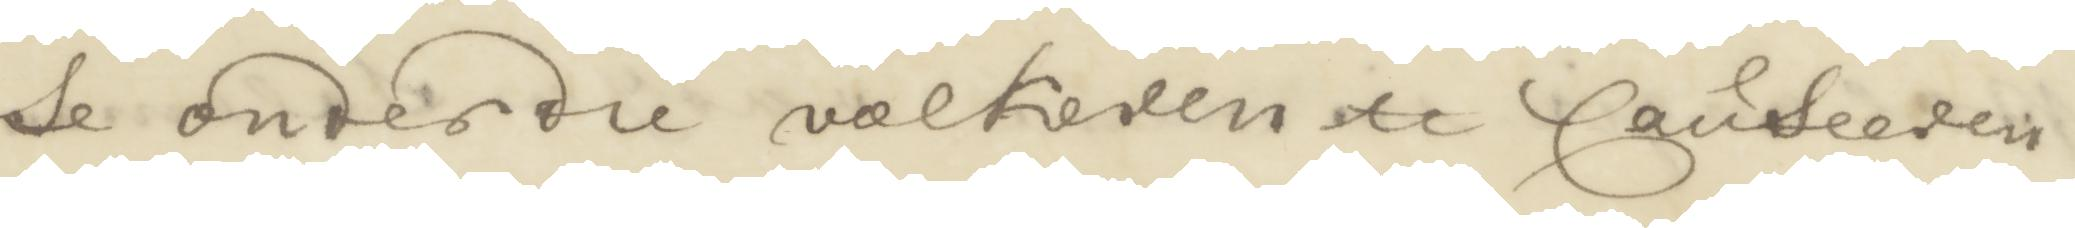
te onder die volkeren te Causeeren
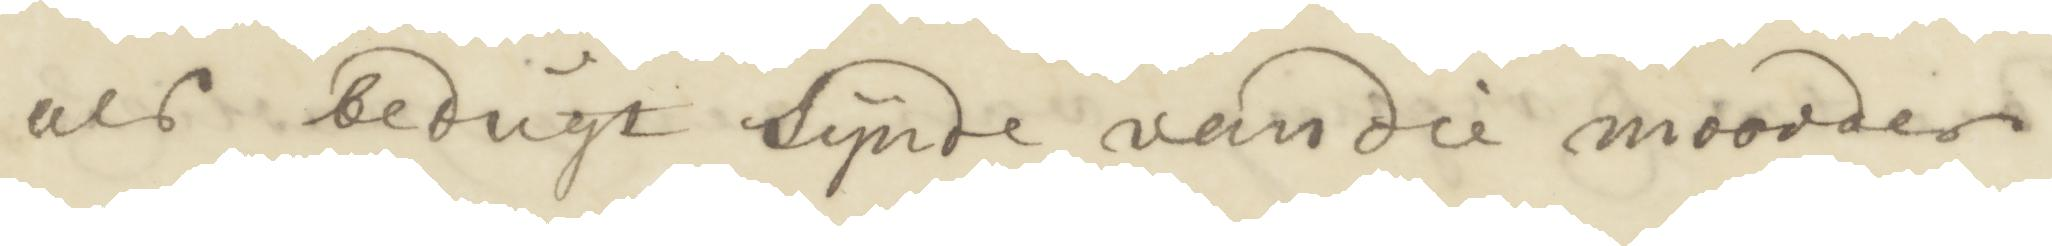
als bedugt sijnde van die moorden
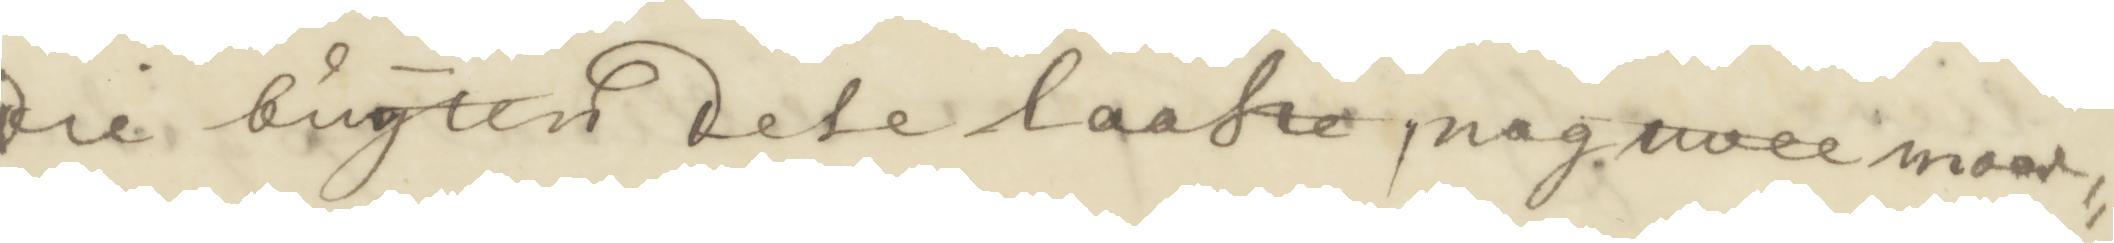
die buijten dese laaste, nog twee moor„
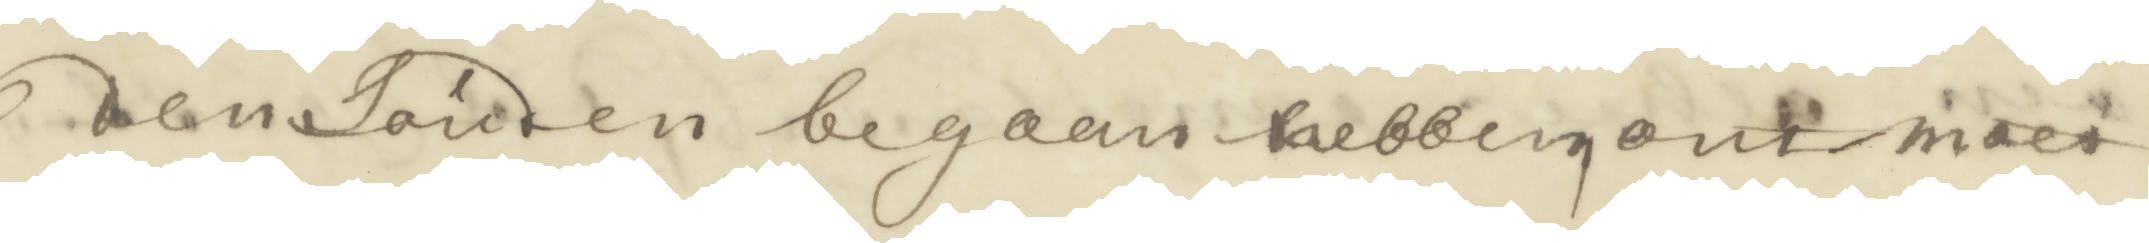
den souden begaan hebben ontmoet
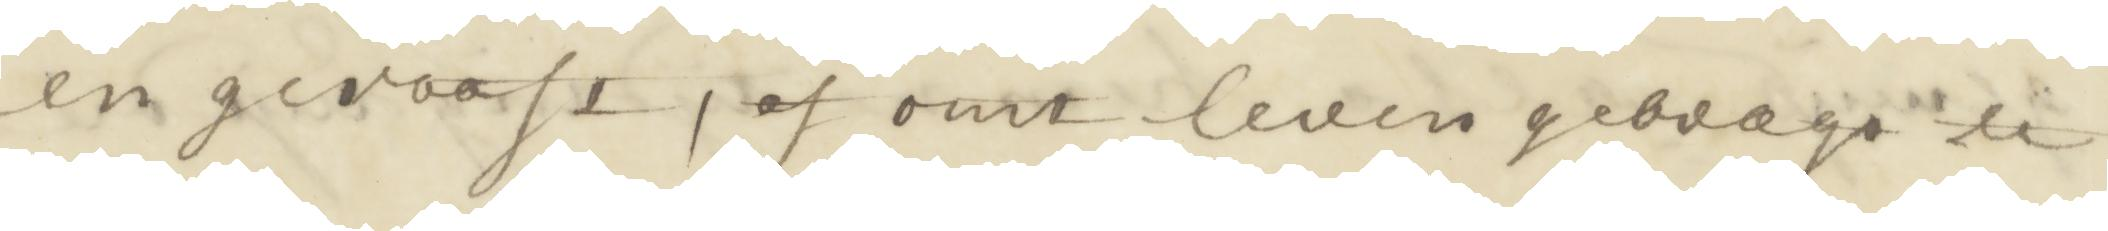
en gerooft, of om 't leven gebragt te
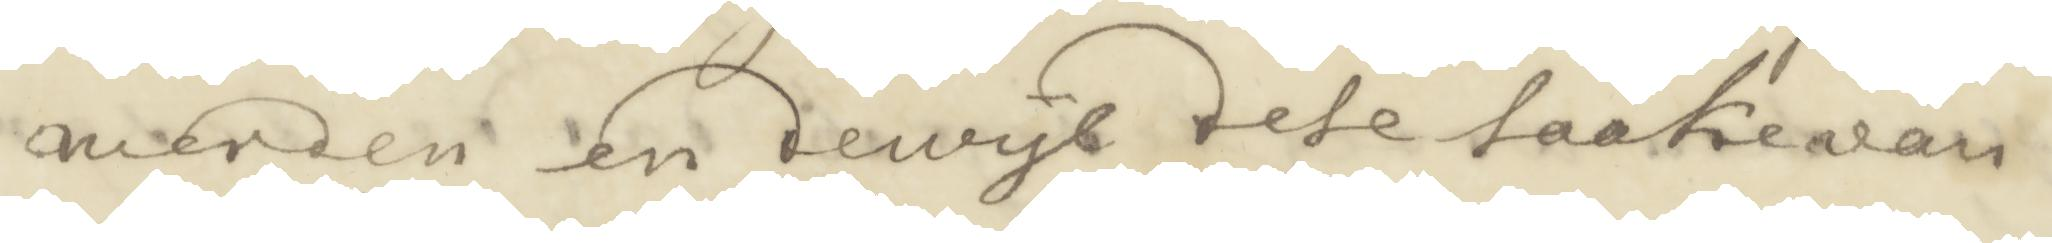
werden en dewijl dese saake van
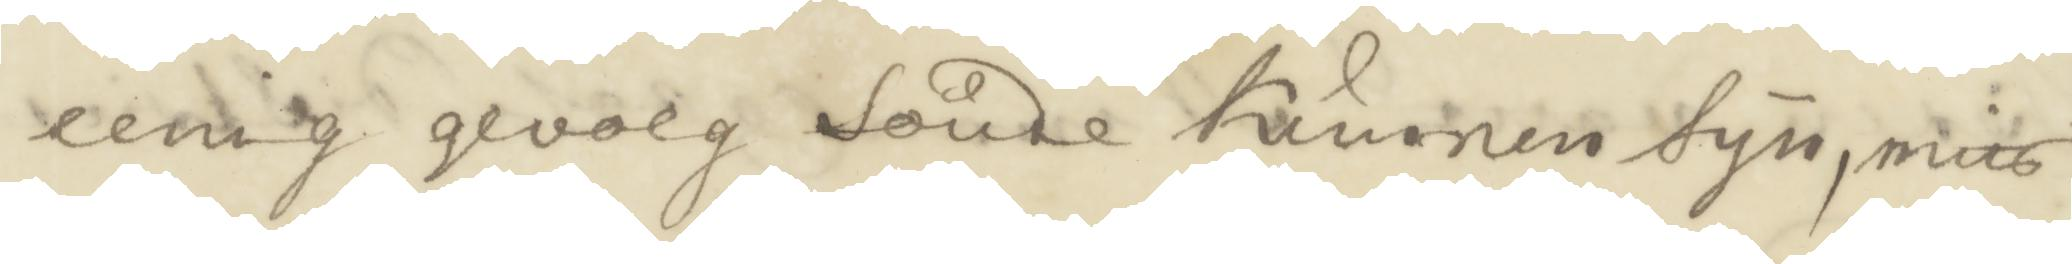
eenig gevolg soude kunnen sijn, mits
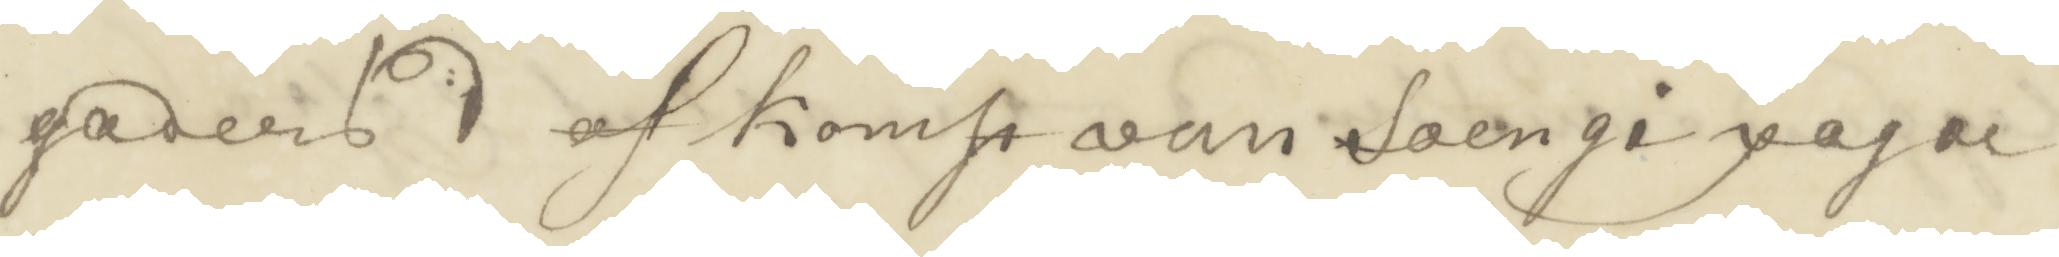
gaders :d af komst van soengi pagoe
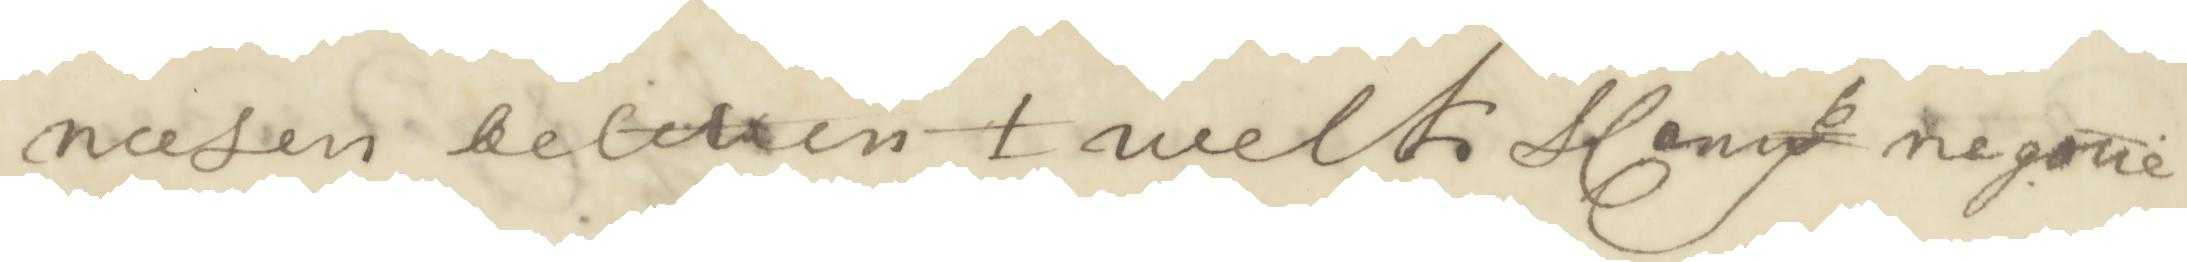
nasen beletten t welk sComp=s negotie
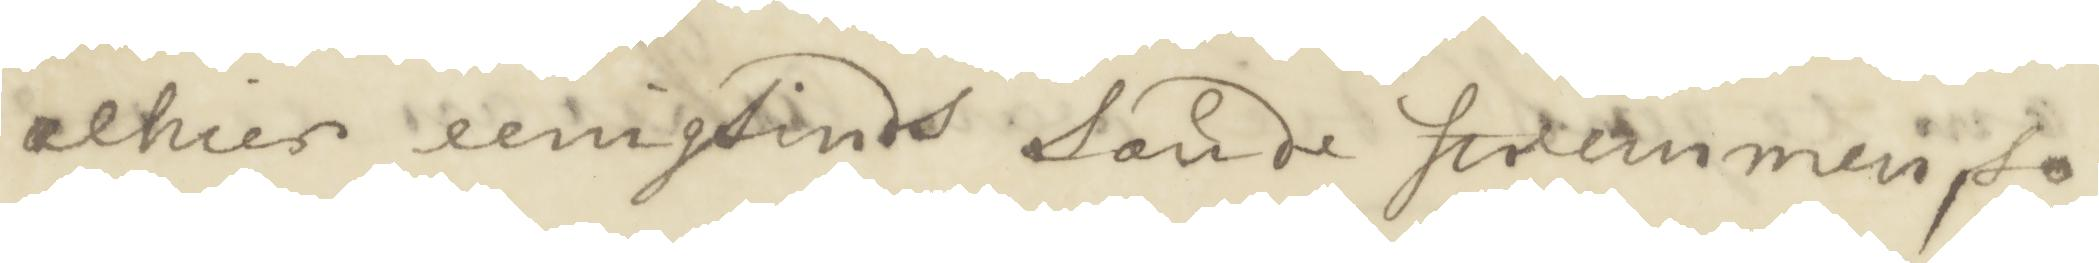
alhier eenigsinds soude stremmen, so
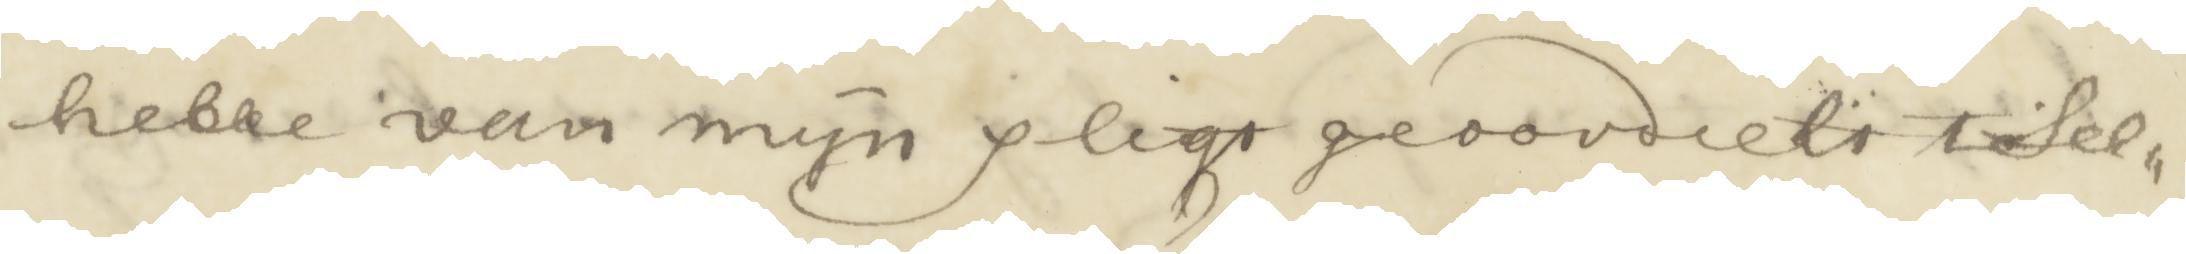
hebbe van mijn pligt geoordeelt t'sel„
